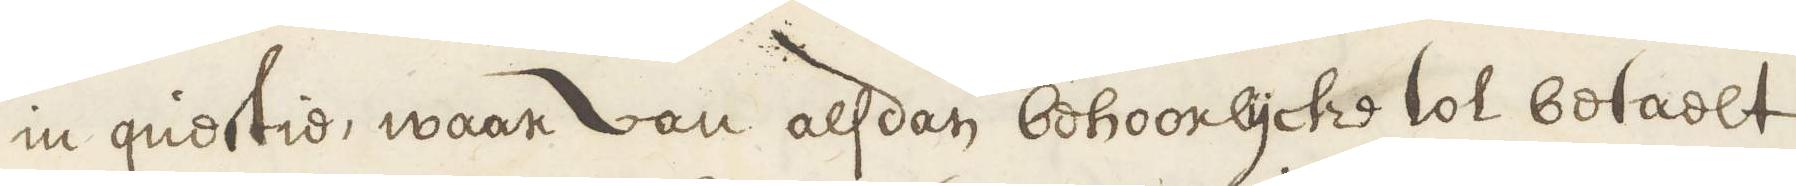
in questie, waar van alsdan behoorlijcke tol betaelt
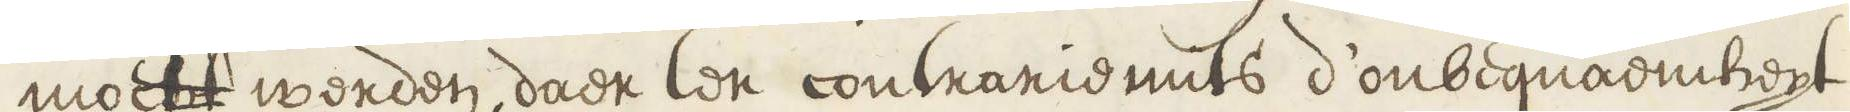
moet werden, daer ter contrarie mits d’ onbequaemheyt
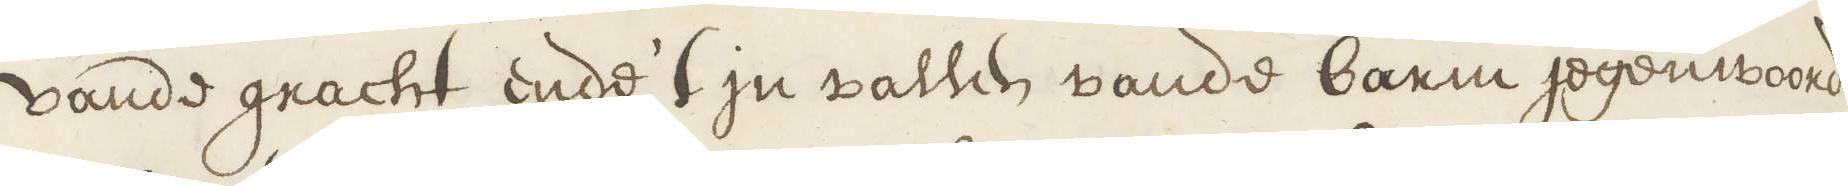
vande gracht ende ’t jn vallen vande barm jegenwoord.h
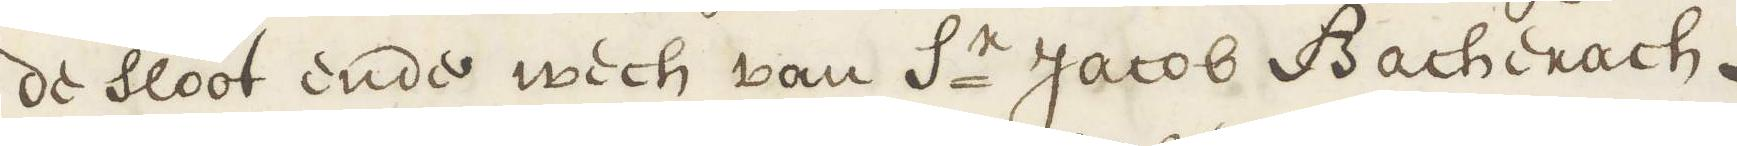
de sloot ende wech van S=r Jacob Bacherach.
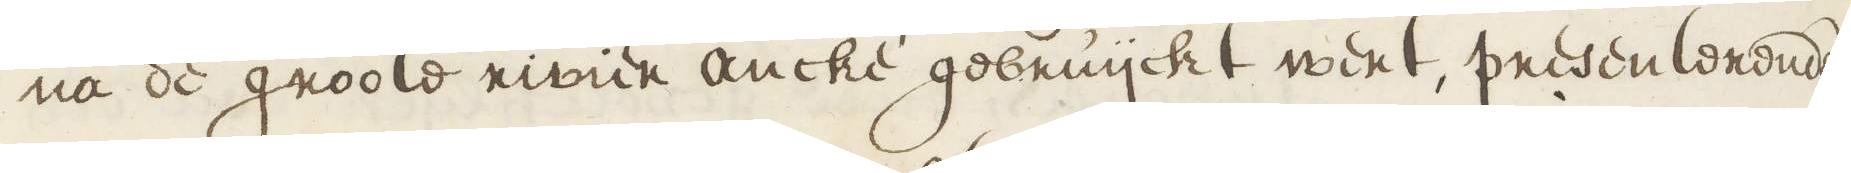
na de groote rivier ancke gebruijckt wert, presenterende
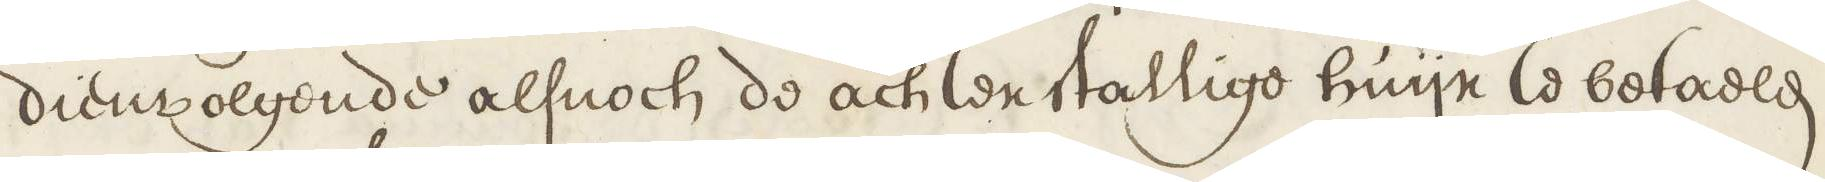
dienvolgende alsnoch de achterstallige huijr te betaelen
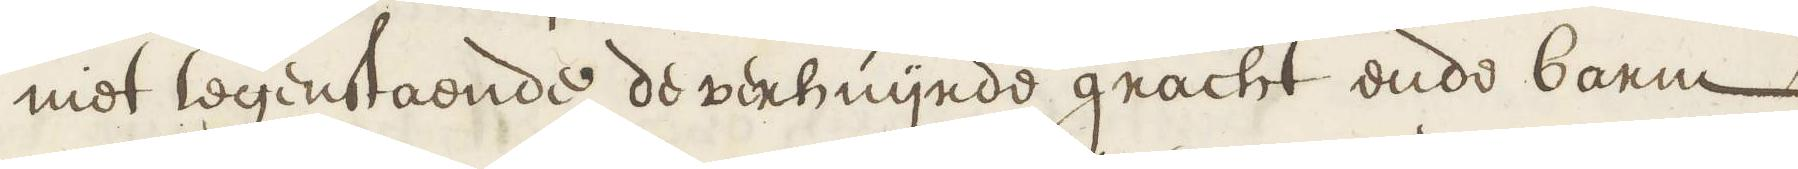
niet tegenstaende de verhuijrde gracht ende barm
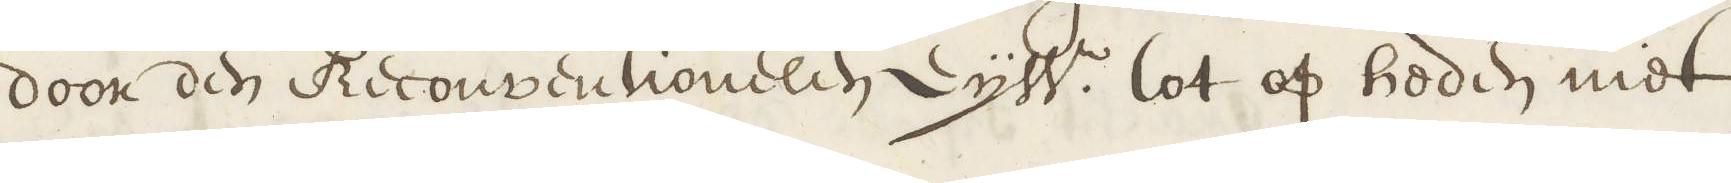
door den Reconventionelen Eijss.r tot op heden niet
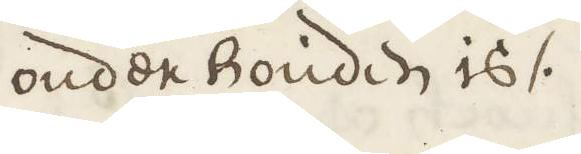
onder houden is/.
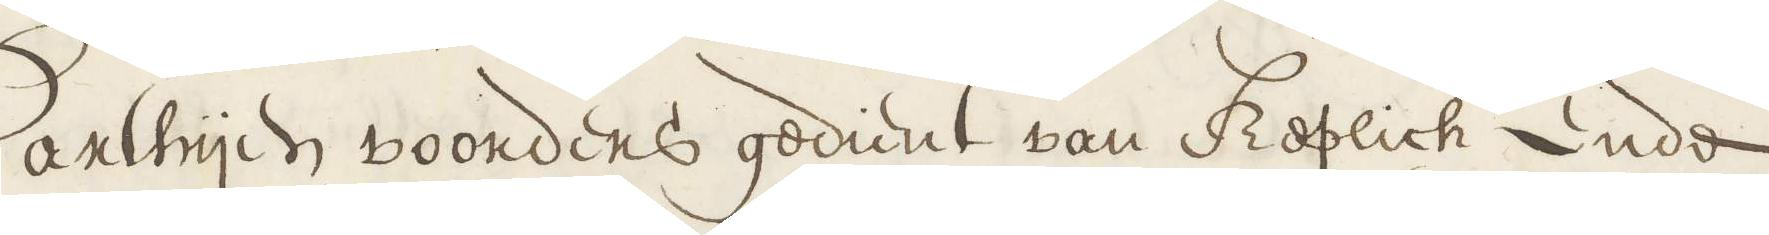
Parthijen voorders gedient van Replick Ende
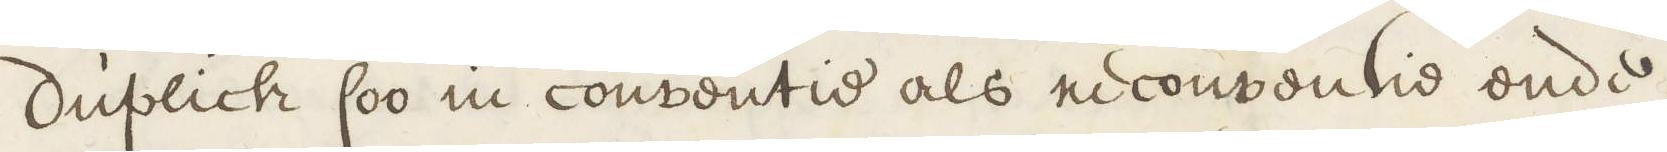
duplick soo in conventie als reconventie ende
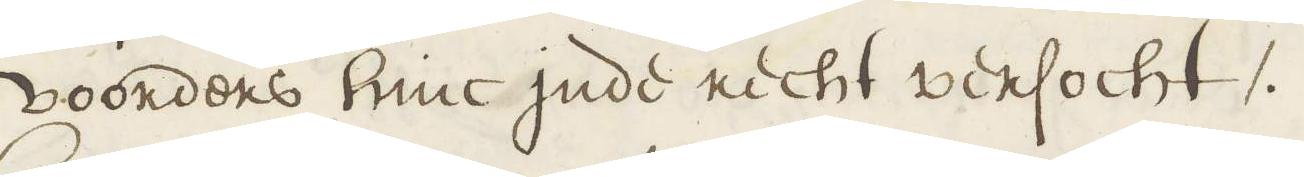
voorders hinc jnde recht versocht /.
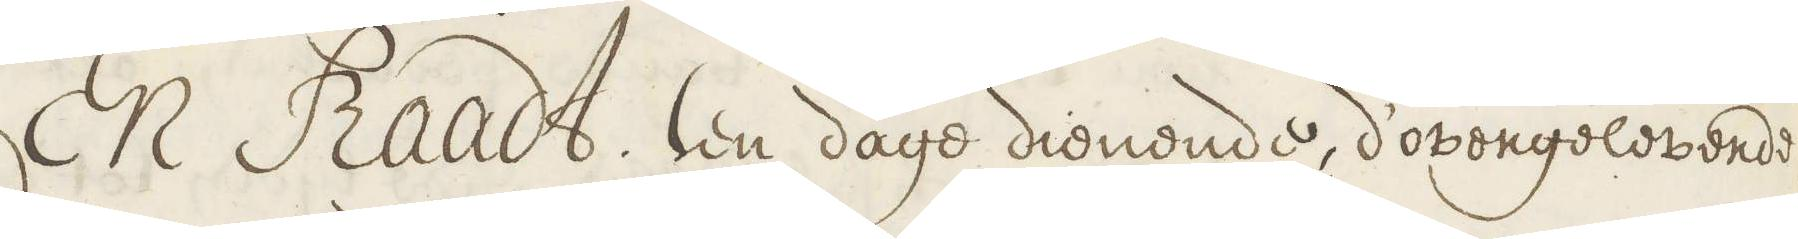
Den Raadt. ten dage dienende, d’overgeleverde
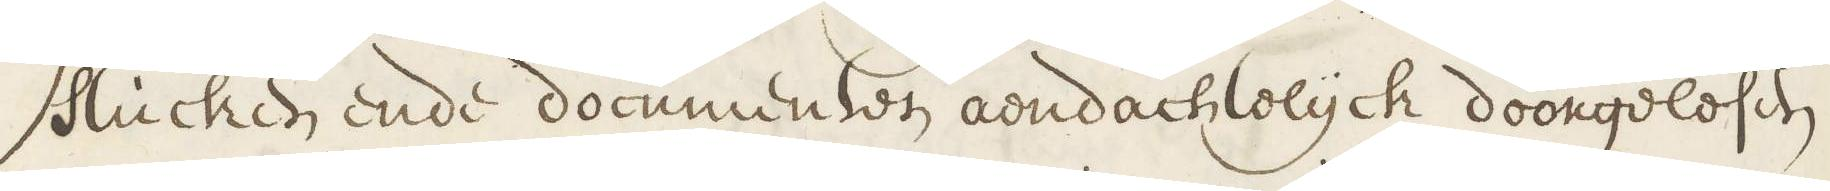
stucken ende documenten aendachtelijck doorgelesen
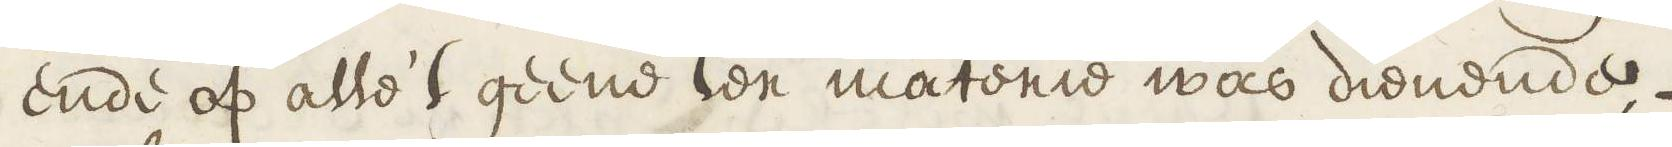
ende op alle ’t geene ter materie was dienende,_
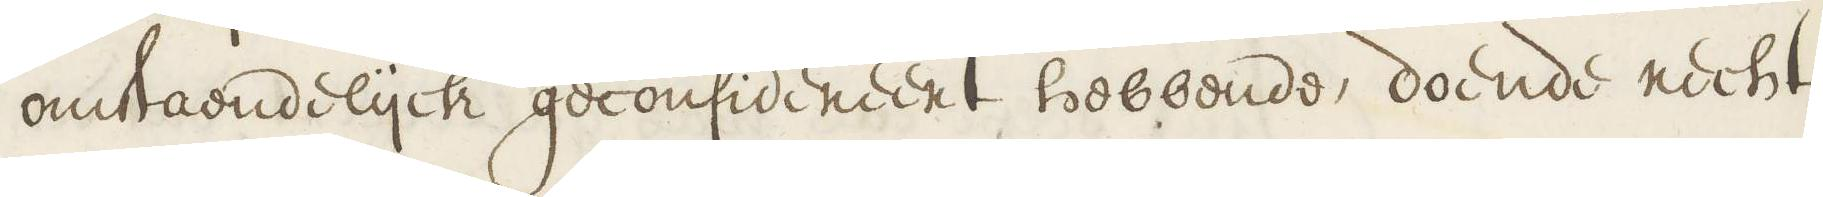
omstaendelijck geconsidereert hebbende, doende recht,
